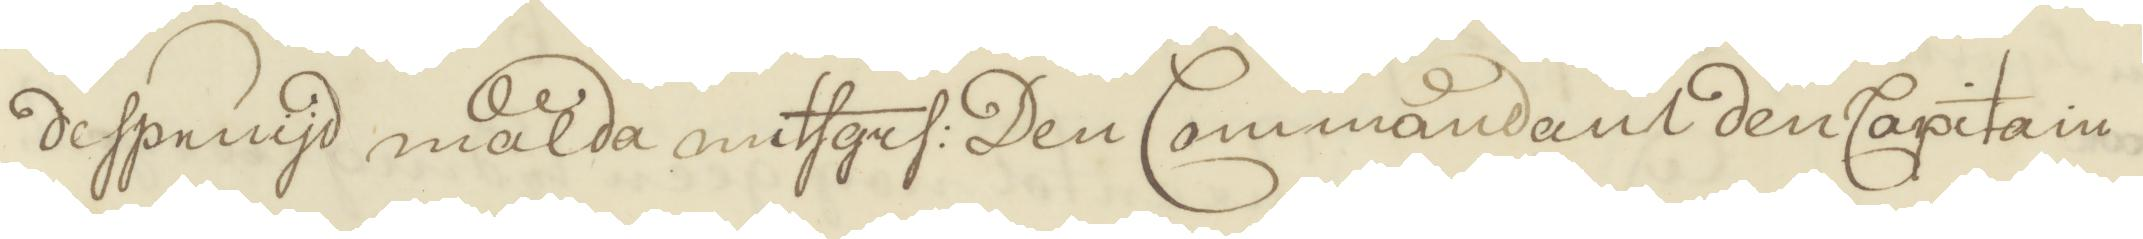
de spruijd malda mitsgrs: Den Commandant den Capitain
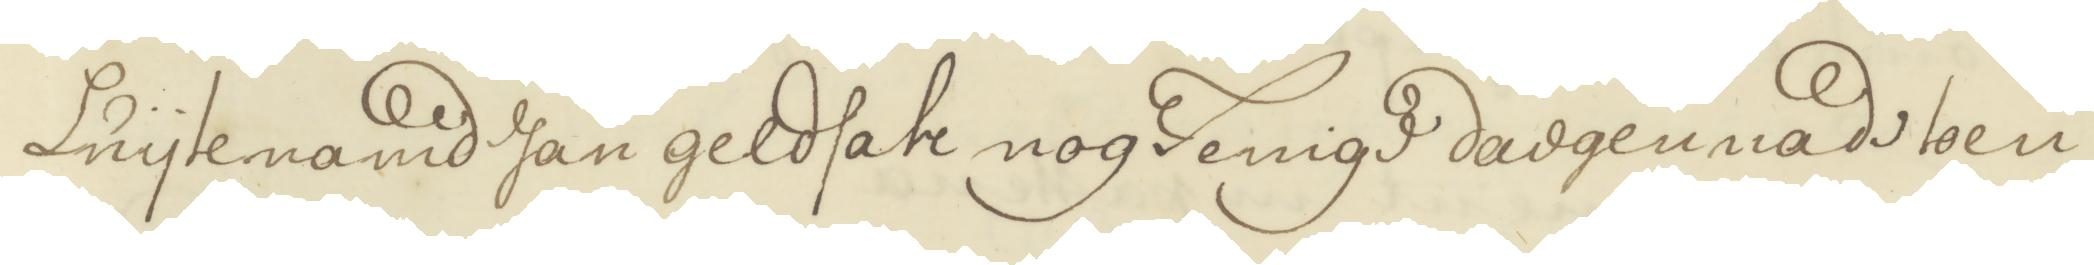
Luijtenamd Jan geldsak nog Eenige daegen na de toen
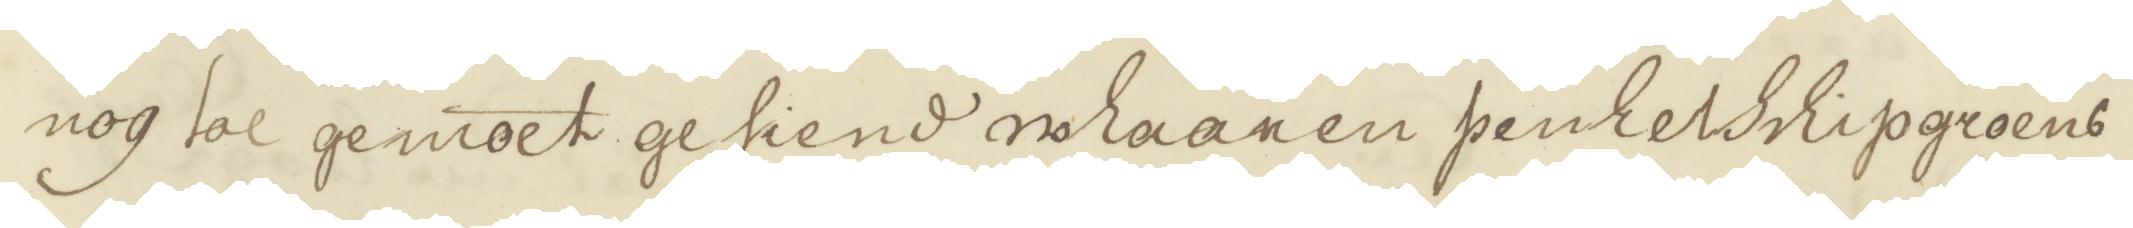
nog toe gemoet gesiene whaaren per het schip groens
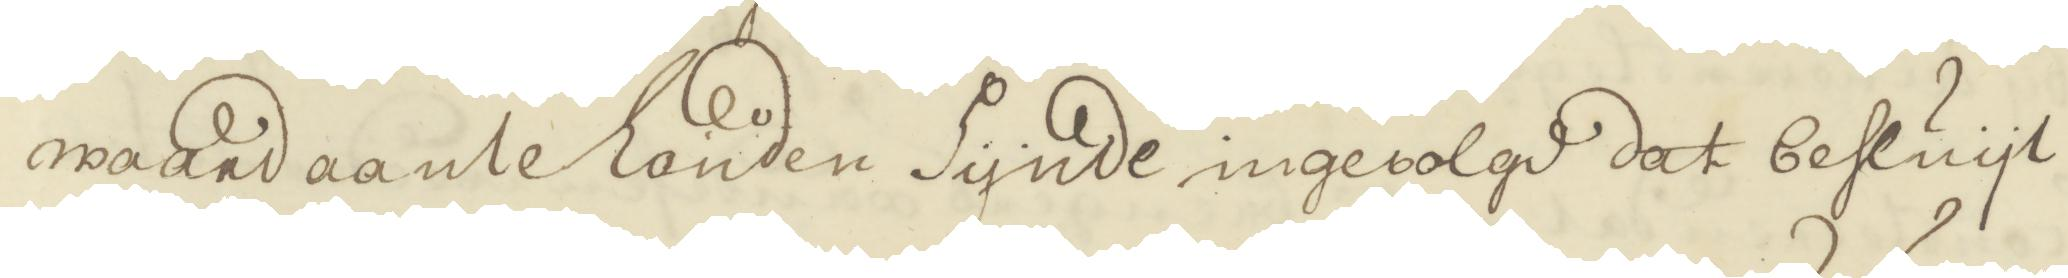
waard aan te houden sijnde ingevolge dat besluijt
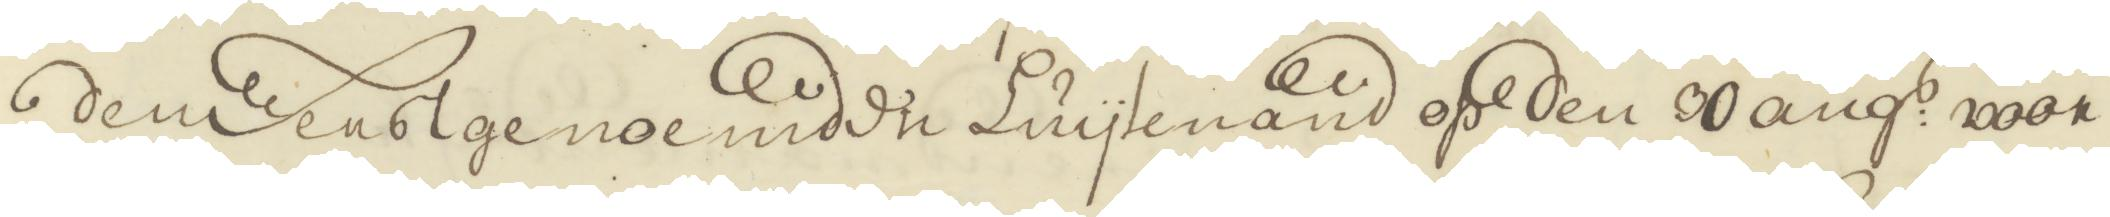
den Eerstgenoemden Luijtenand op den 30 aug:s voor
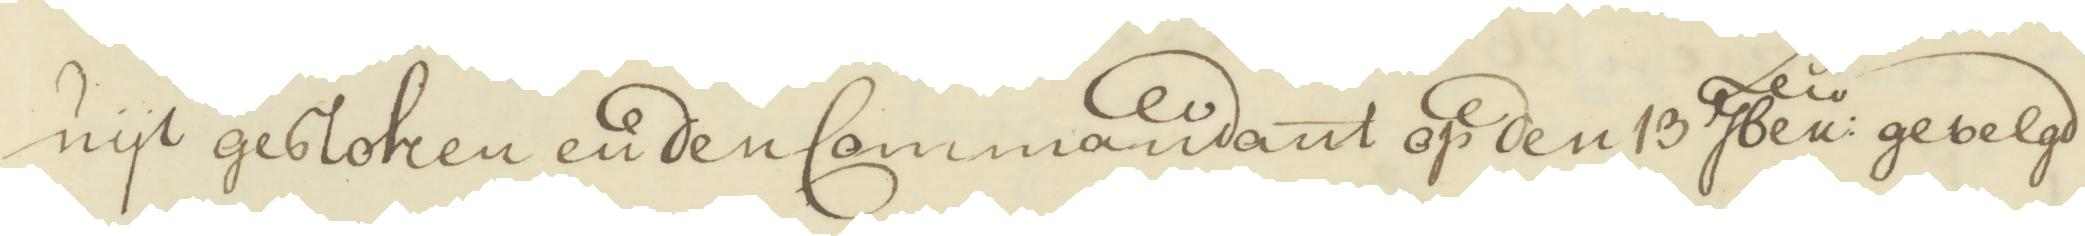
uijt gestoken en den Commandant op den 13 7ber: gevelgd
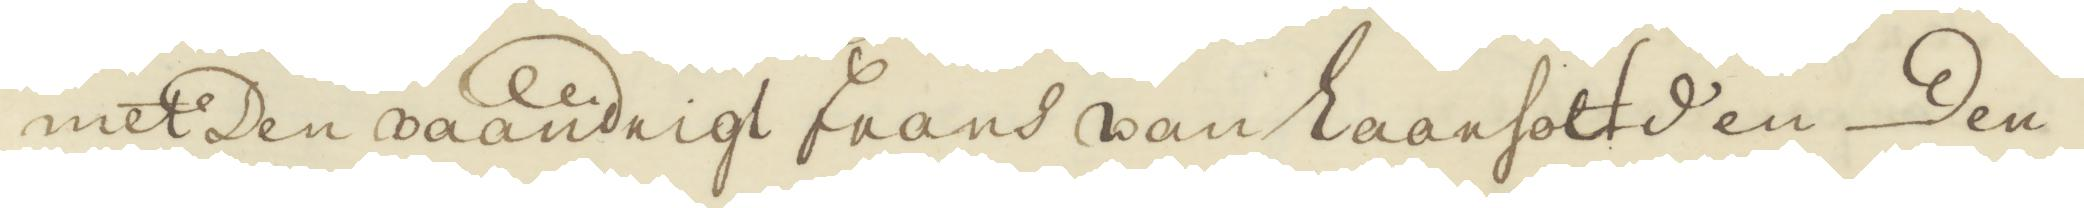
met Den vaandrigt frans van haarsolte en Den
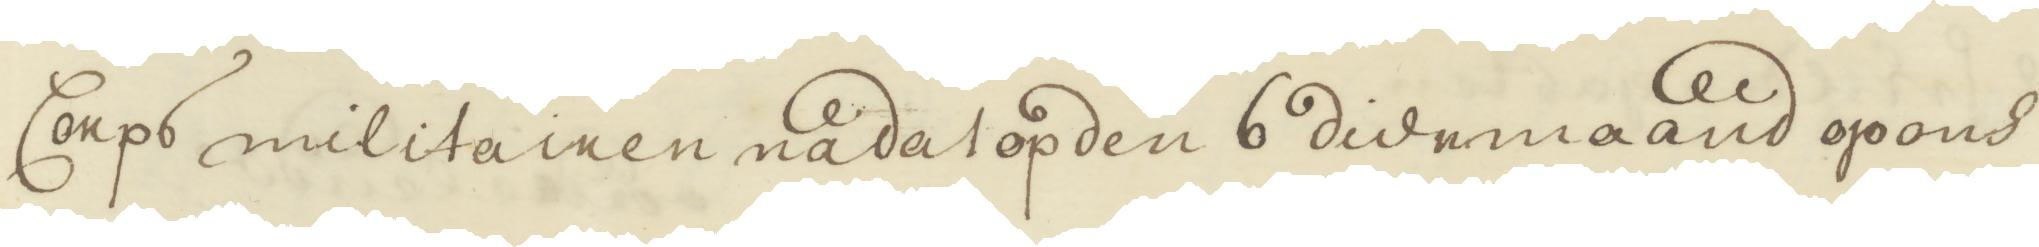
Corps militairen nadat op den 6 dier maand op ons
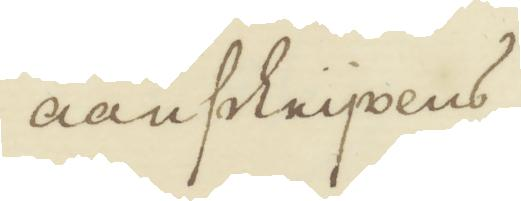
aanschrijvens
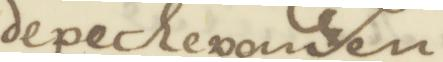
depeche van Een
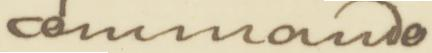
commando
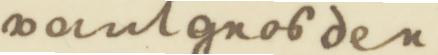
vant gros der
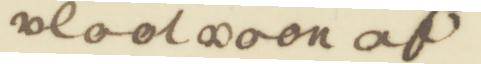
vloot voor af
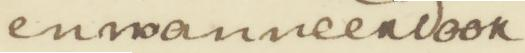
en wanneer door
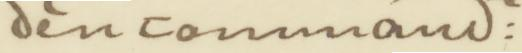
den command:t
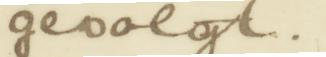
gevolgt.
